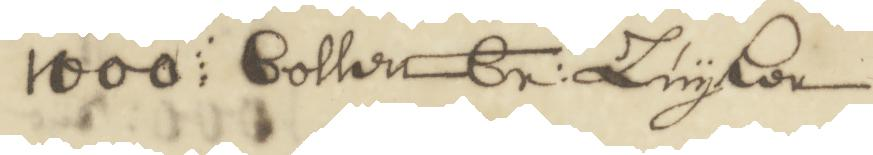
1000: bollen br: zuijker
